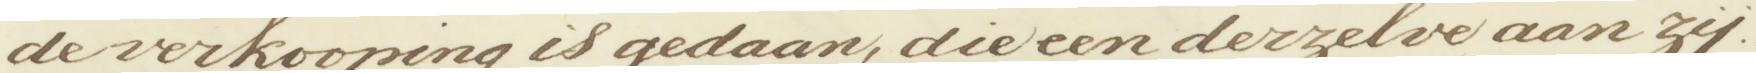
de verkooping is gedaan, die een derzelve aan zij„
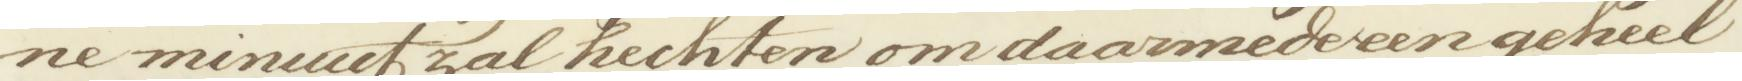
ne minuut zal hechten om daarmede een geheel
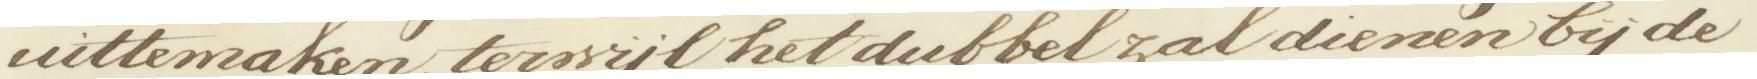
uittemaken, terwijl het dubbel zal dienen bij de
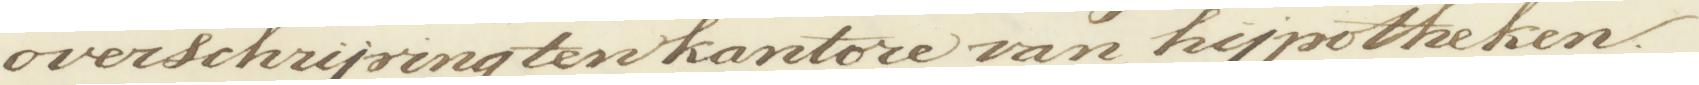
overschrijving ten kantore van hijpotheken.
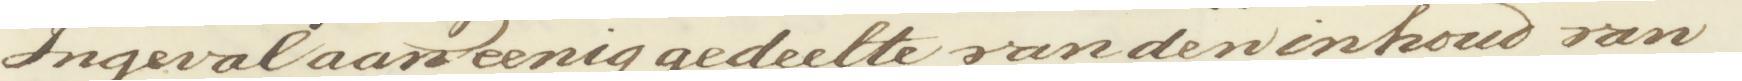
Ingeval aan eenig gedeelte van den inhoud van
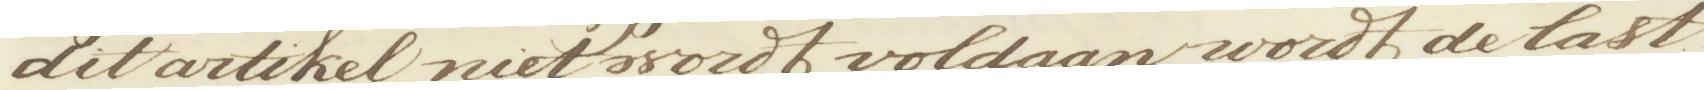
dit artikel niet wordt voldaan, wordt de last„
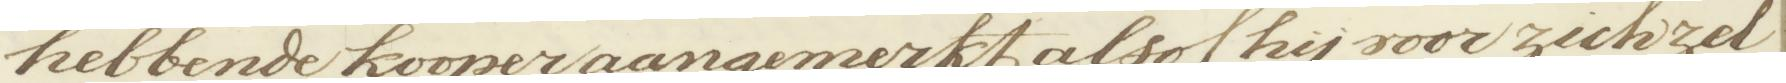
hebbende kooper aangemerkt alsof hij voor zich zel
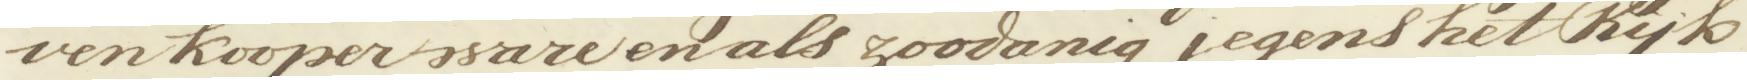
ven kooper ware en als zoodanig jegens het Rijk
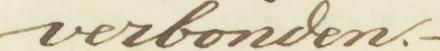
verbonden.-
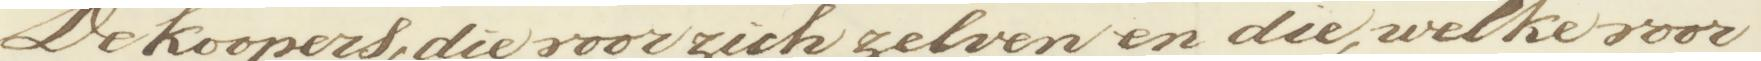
De koopers, die voor zich zelven en die welke voor
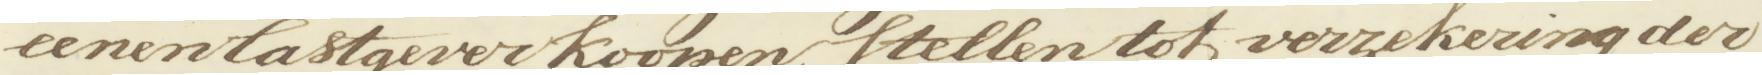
eenen lastgever koopen, stellen tot verzekering der
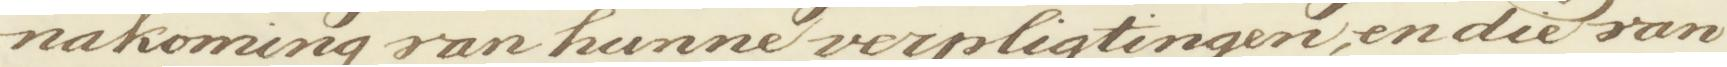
nakoming van hunne verpligtingen en die van
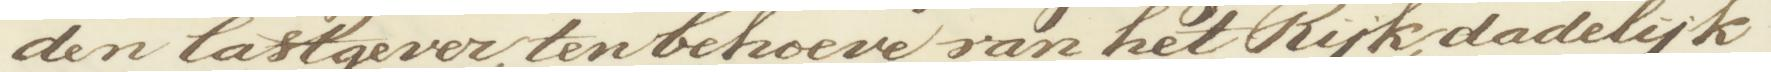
den lastgever, ten behoeve van het Rijk dadelijk
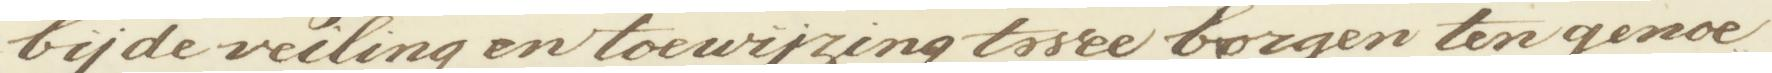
bij de veiling en toewijzing twee borgen ten genoe„
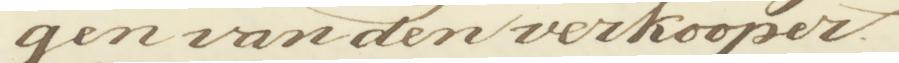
gen van den verkooper.
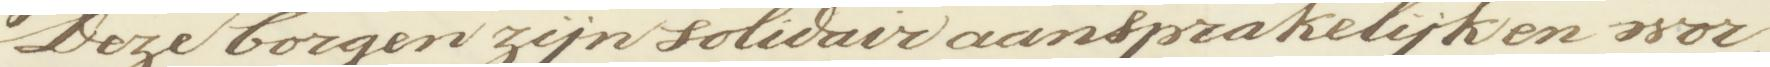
Deze borgen zijn solidair aansprakelijk en wor
